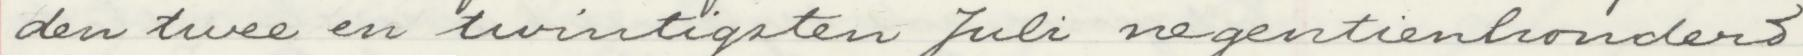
den twee en twintigsten Juli negentienhonderd
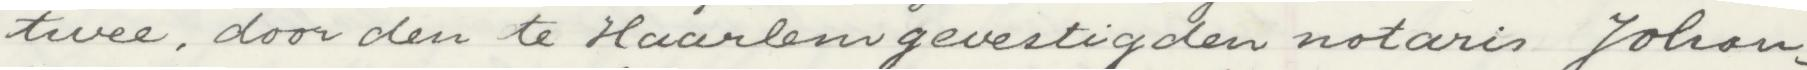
twee, door den te Haarlem gevestigden notaris Johan„
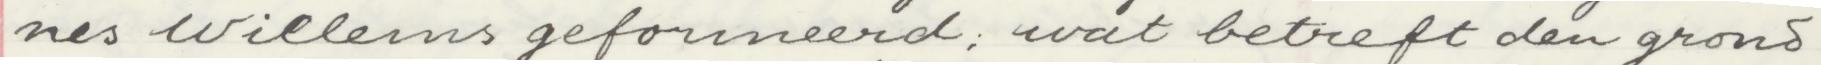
nes Willems geformeerd; wat betreft den grond
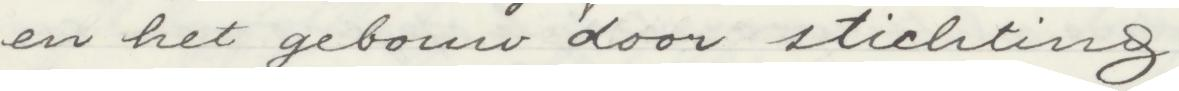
en het gebouw door stichting
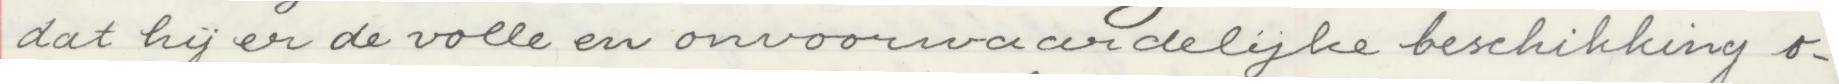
dat hij er de volle en onvoorwaardelijke beschikking o-
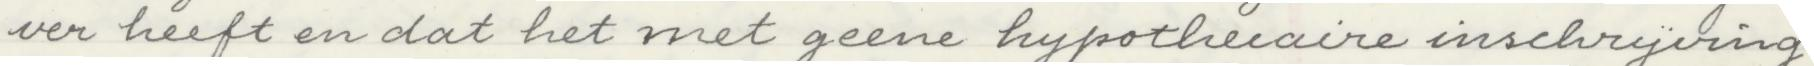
ver heeft en dat het met geene hypothecaire inschrijving
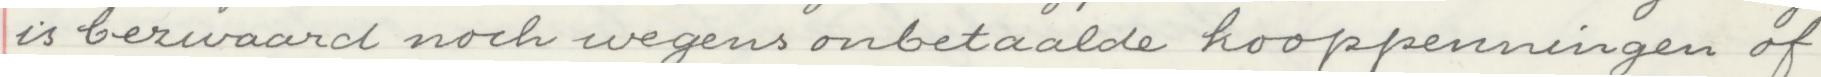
is bezwaard noch wegens onbetaalde kooppenningen of
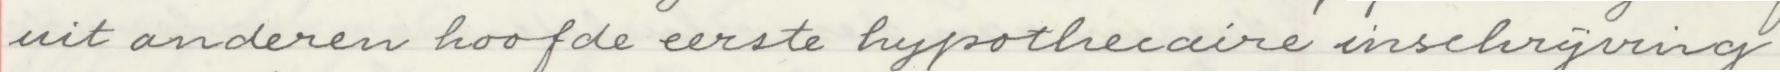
uit anderen hoofde eerste hypothecaire inschrijving
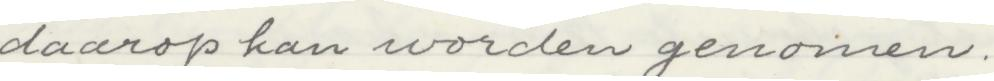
daarop kan worden genomen
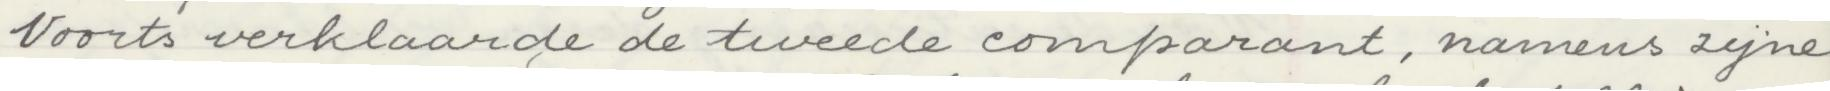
Voorts verklaarde de tweede comparant, namens zijne
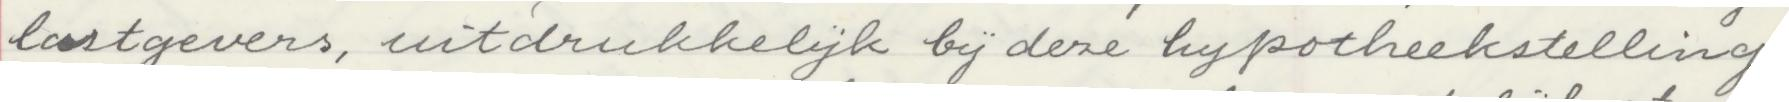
lastgevers, uitdrukkelijk bij deze hypotheekstelling
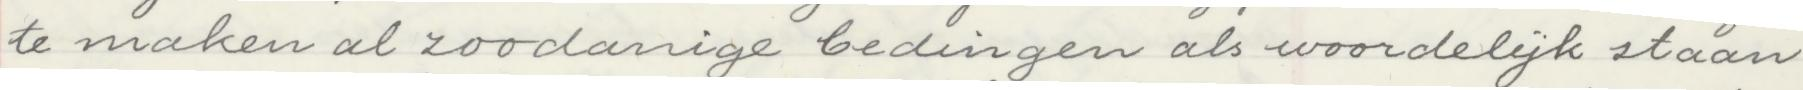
te maken al zoodanige bedingen als woordelijk staan
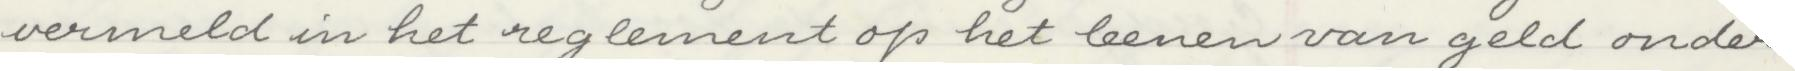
vermeld in het reglement op het leenen van geld onder
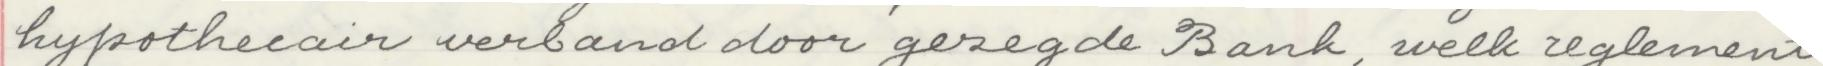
hypothecair verband door gezegde Bank, welk reglement
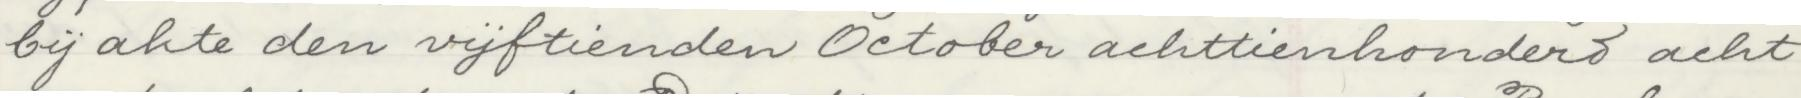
bij akte den vijftienden October achttienhonderd acht
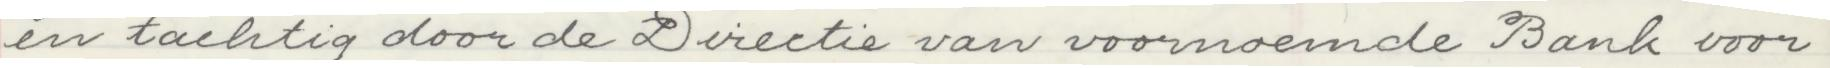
en tachtig door de Directie van voornoemde Bank voor
